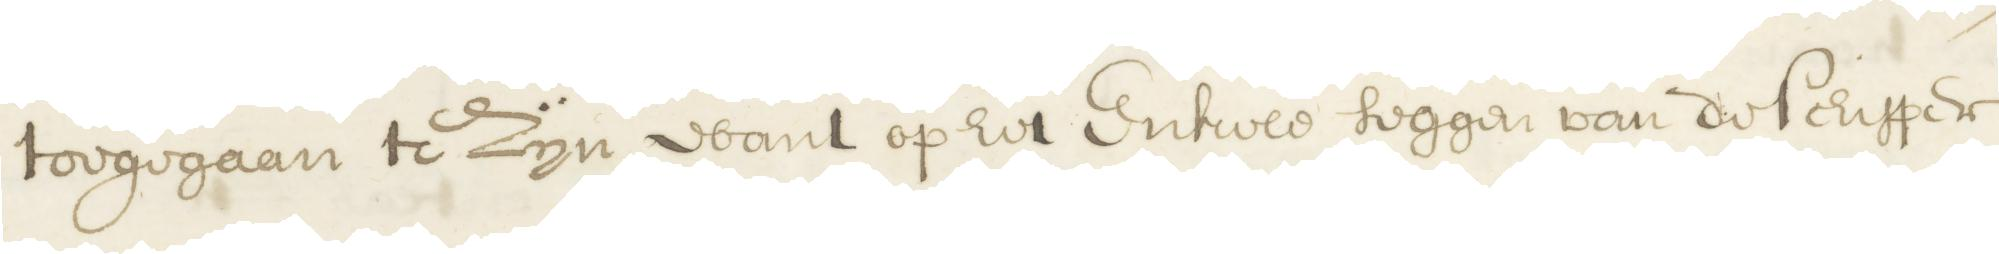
toegegaan te zijn, want op het Enkele seggen van de schipper
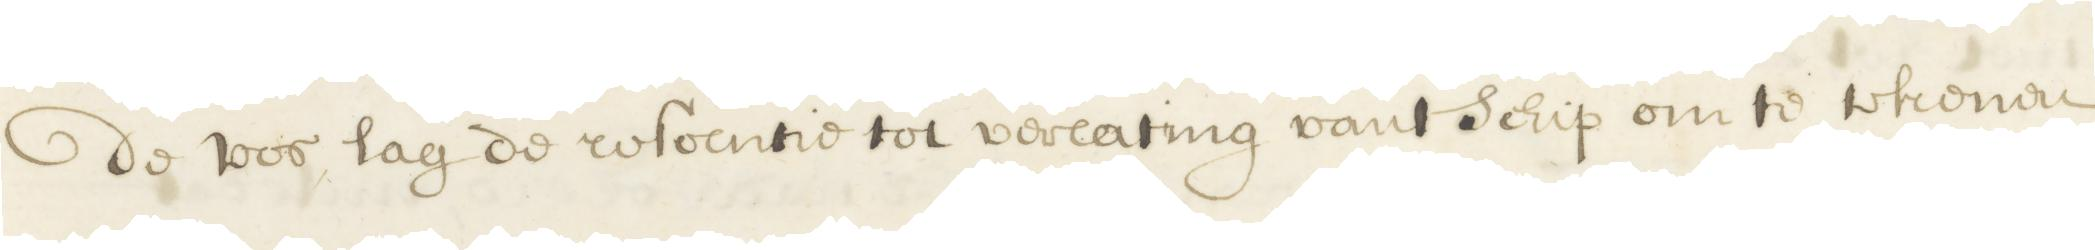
de vos, lag de resolutie tot verlating van’t schip om te tekenen
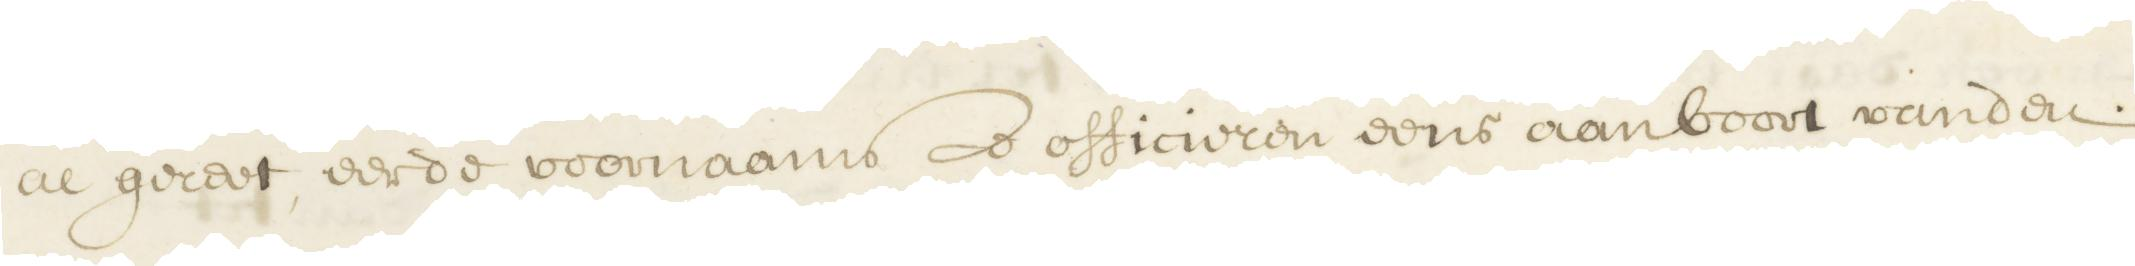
al gereet, eerde voornaamste officieren eens aanboort vanden
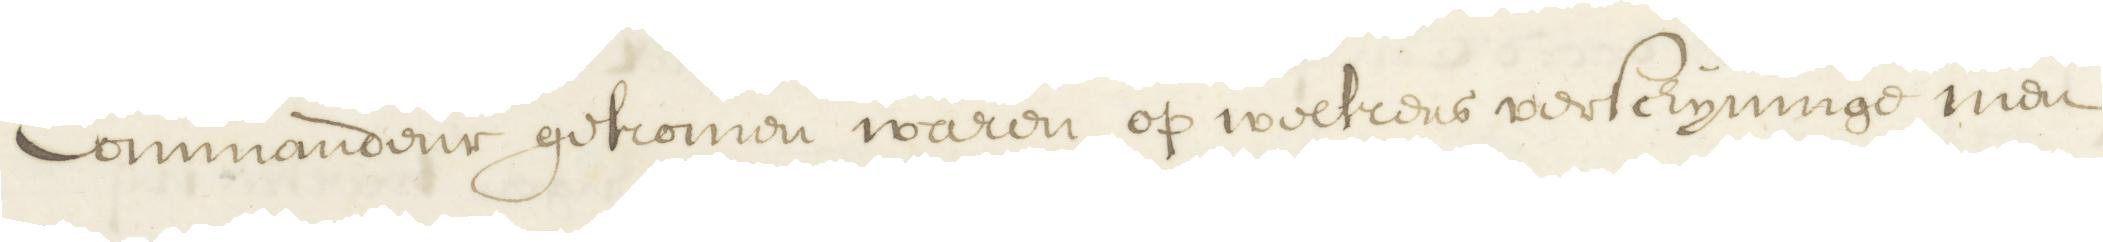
Commandeur gekomen waren, op welkers verschijninge men
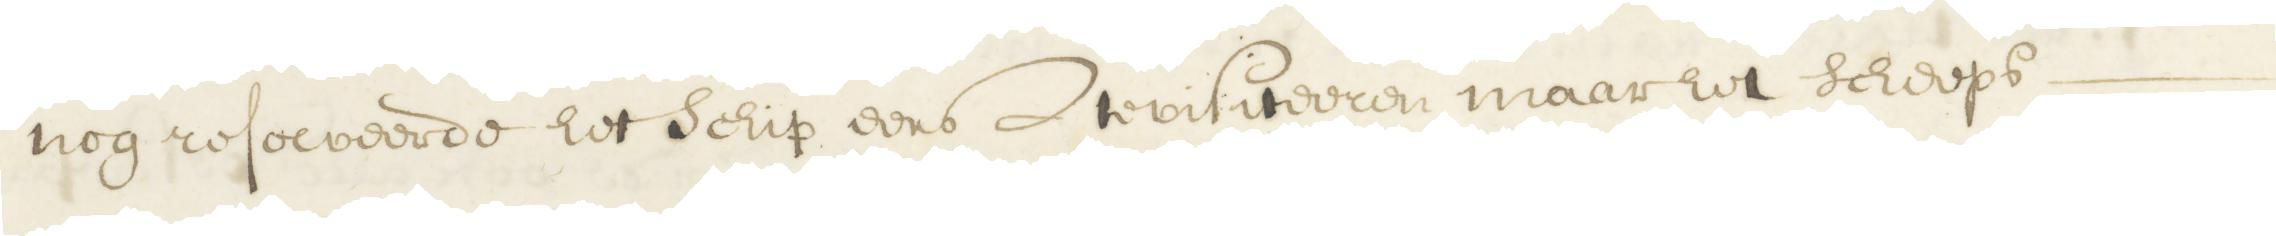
nog resolveerde het schip eerst tevisiteeren maar het scheeps —
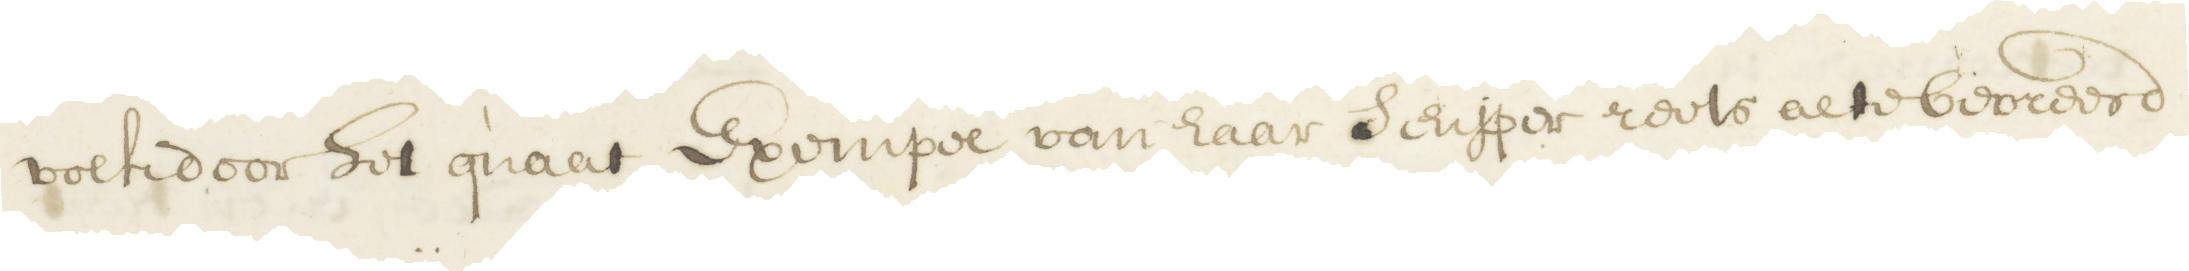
volk door het quaat Exempel van haar schipper reets altebevreesd
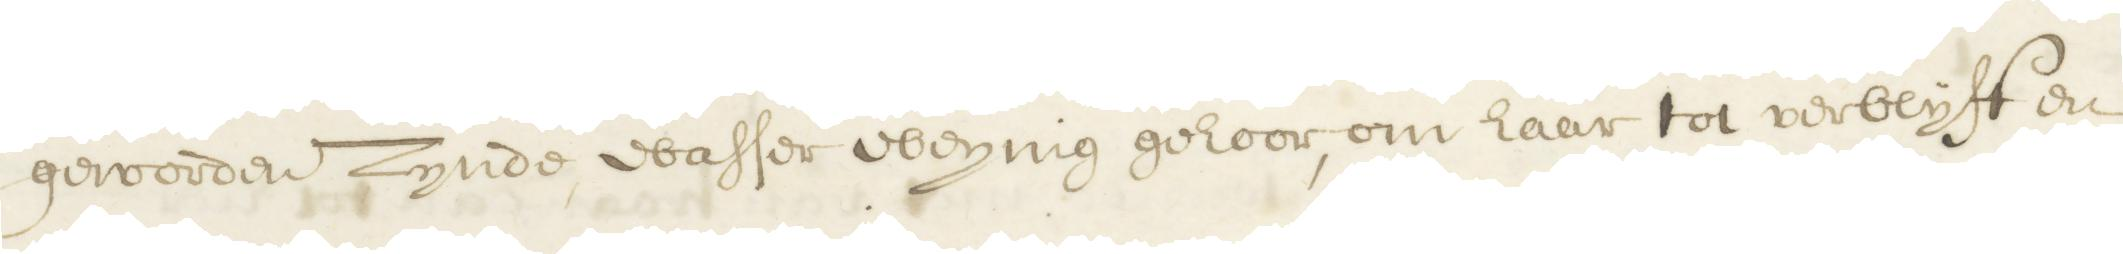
geworden zijnde, wasser weijnig gehoor, om haar tot verblijff en
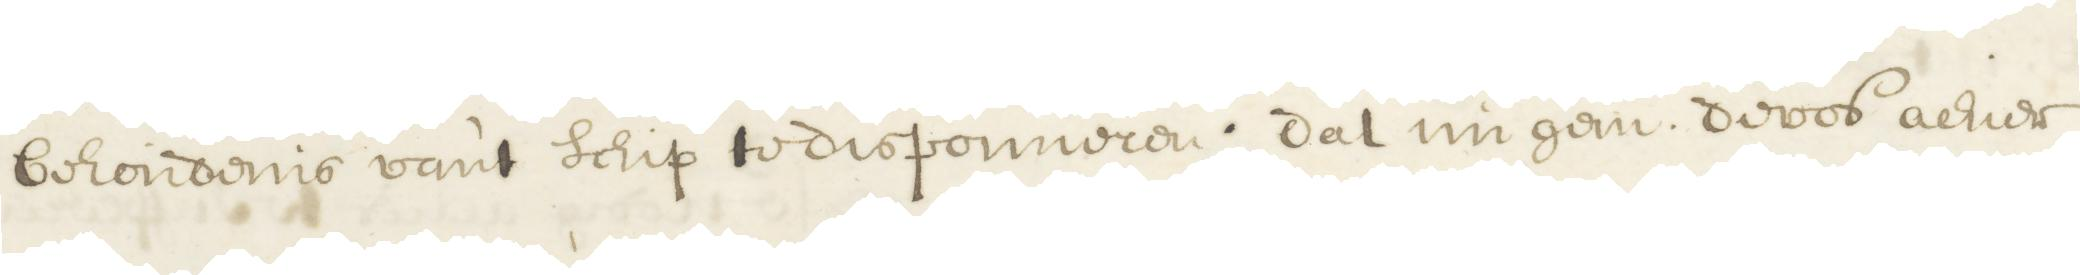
behoudenis van’t schip te disponneren; dat nu gem: devos alhier
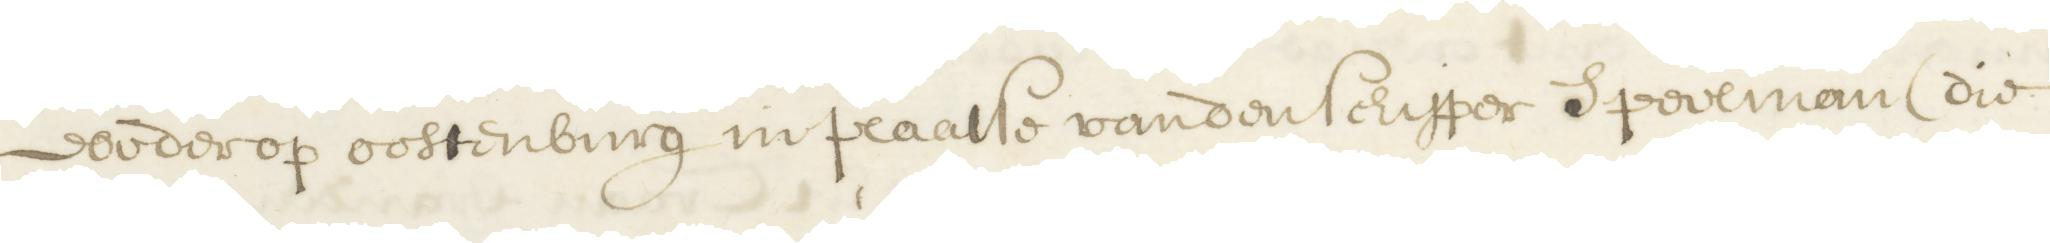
weder op oostenburg in plaatse van den schipper speelman (die
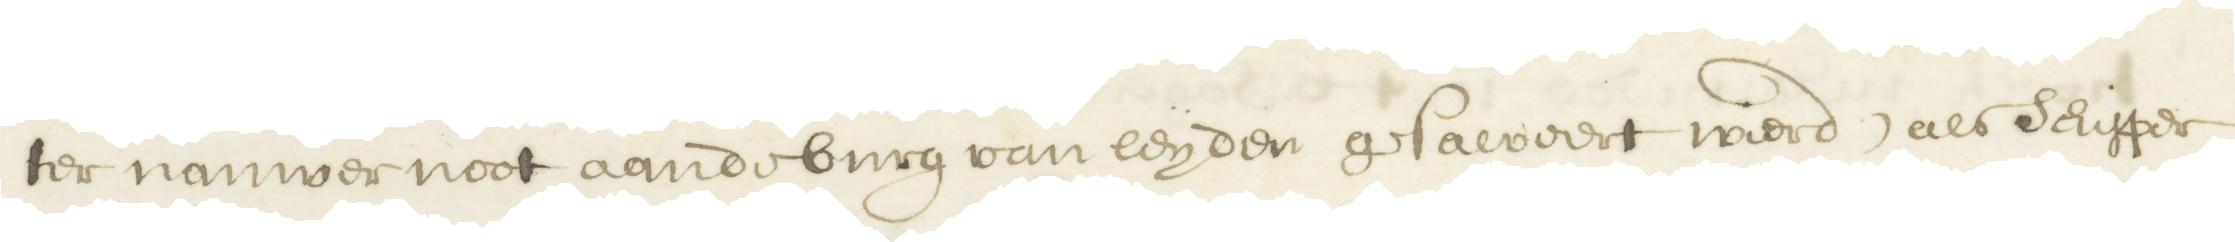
ter nauwer noot aandeburg van leijden gesalveert wierd) als schipper
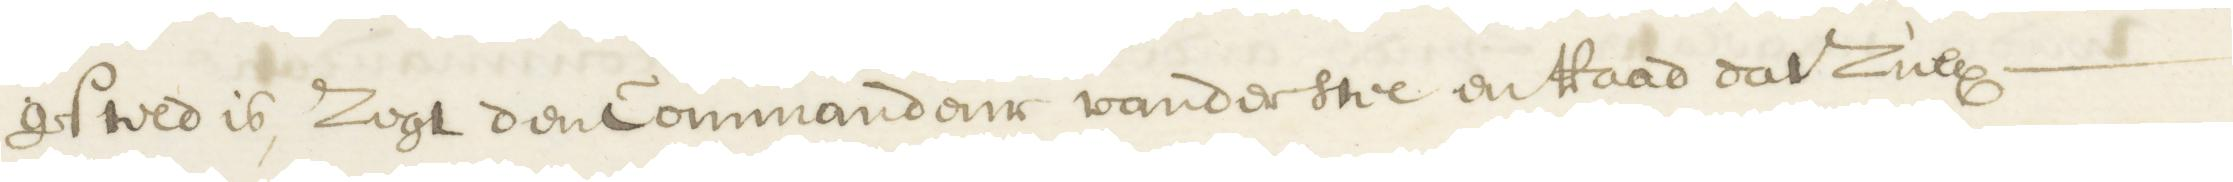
gesteld is, zegt den Commandeur vanderstel en raad dat zulx —
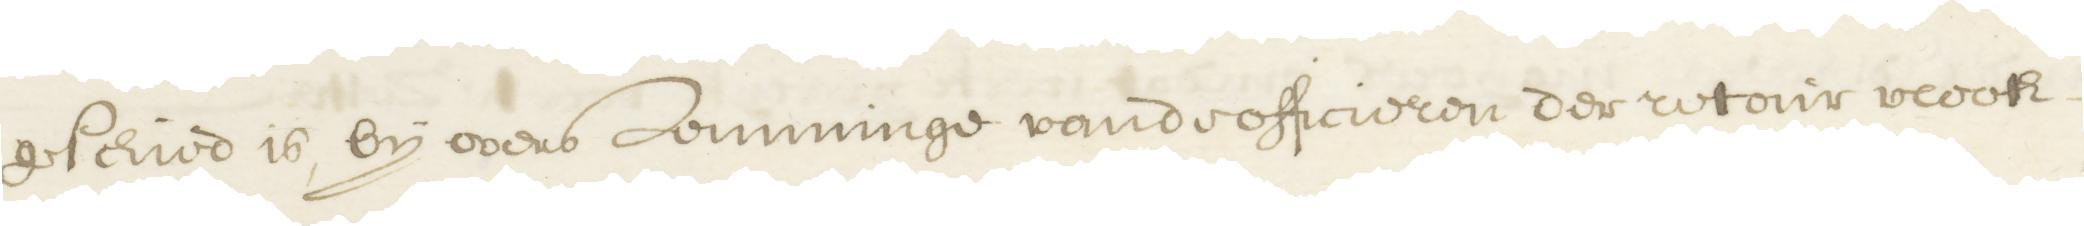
geschied is, bij overstemminge van de officieren der retour vlooth
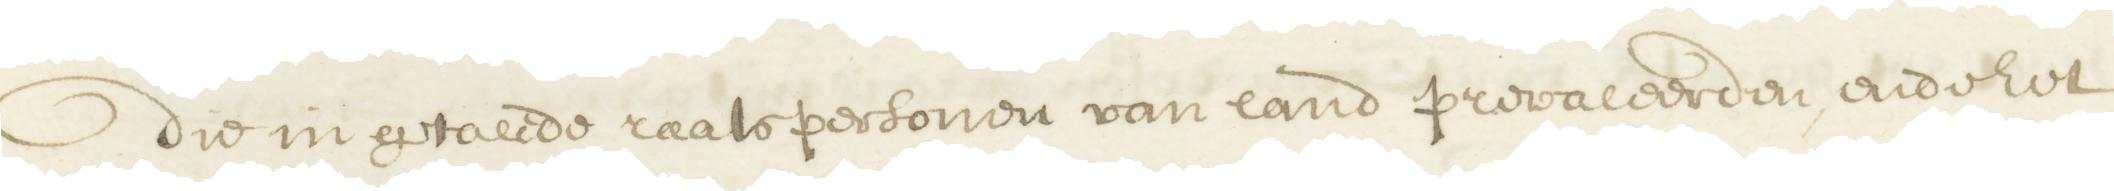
die in getalede raatspersonen van land prevaleerden, ende het
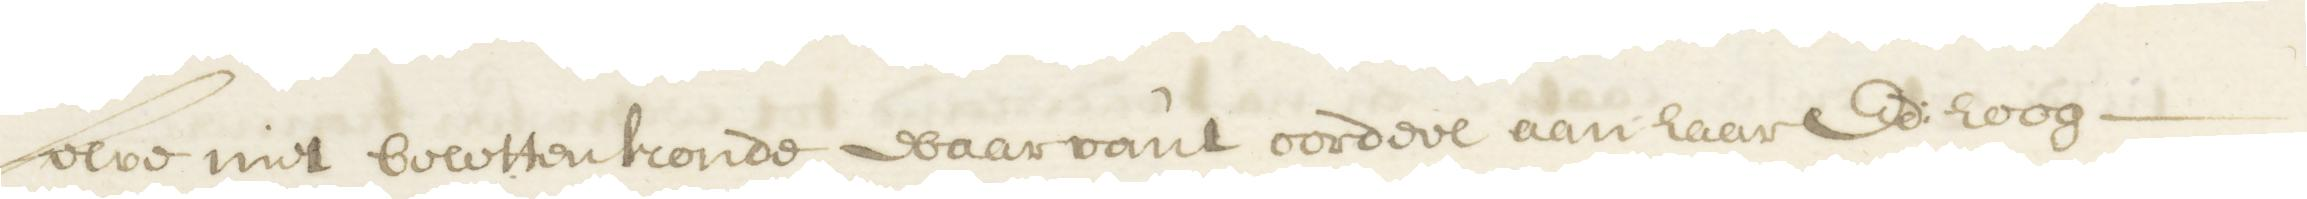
selve niet beletten konde, waar van’t oordeel aan haar Ed: hoog —
